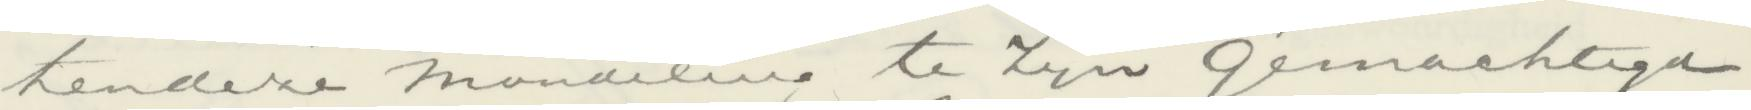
ten deze mondeling te zyn gemachtigd
